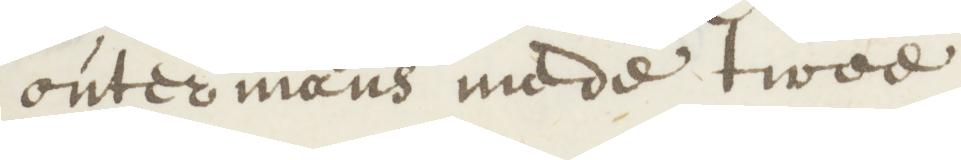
outermans mede twee
